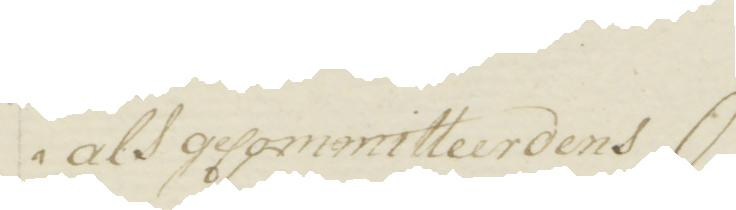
^als gecommitteerdens
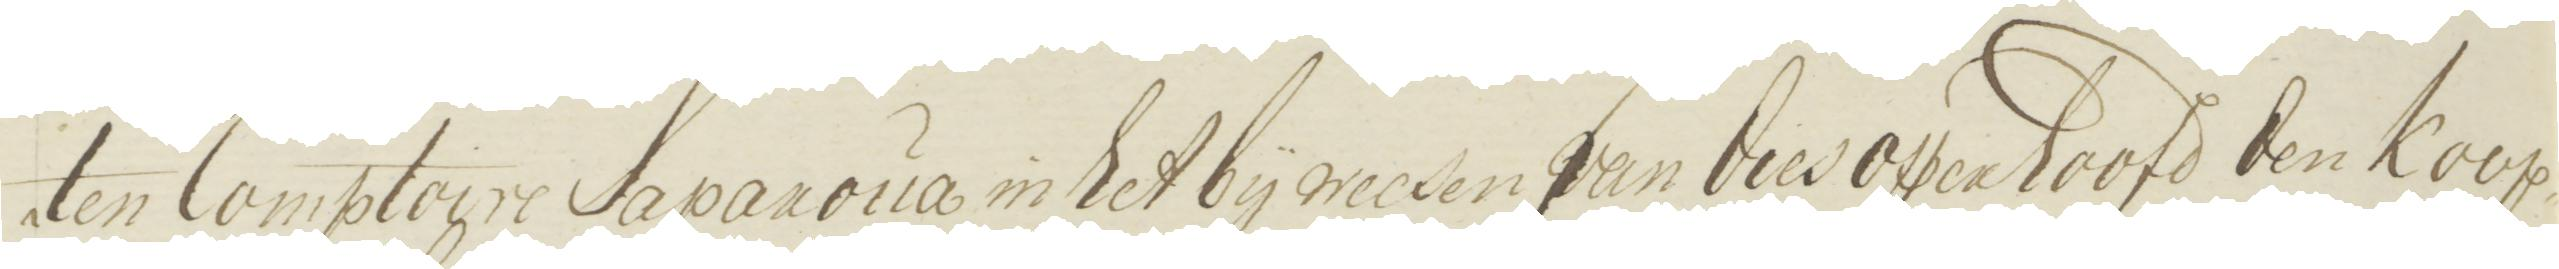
^ten Comptoire Saparoua in het bij weesen van dees opperhoofd den koop
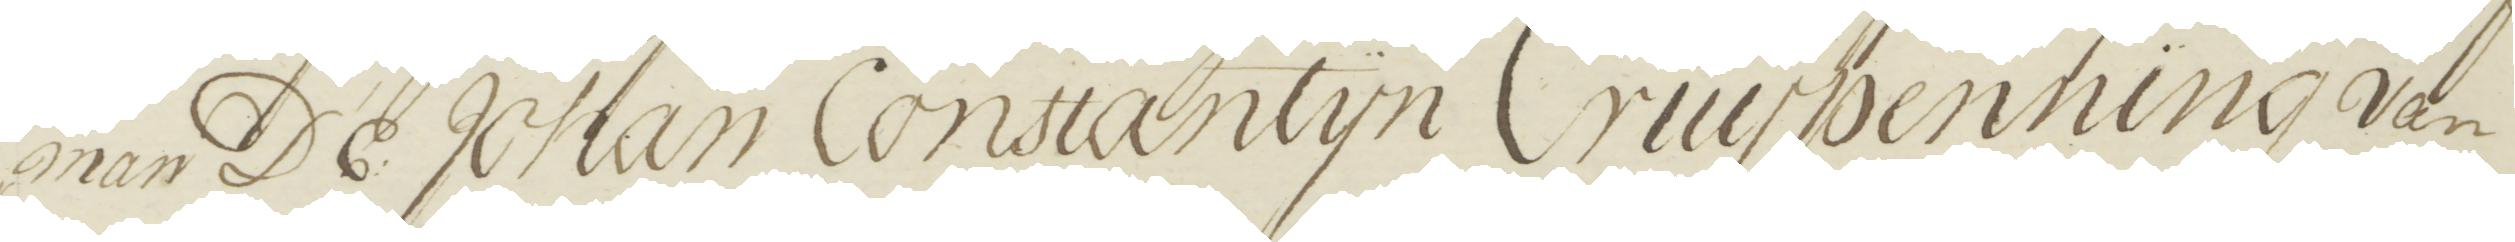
man D E: Johan Constantijn Cruijpenning van
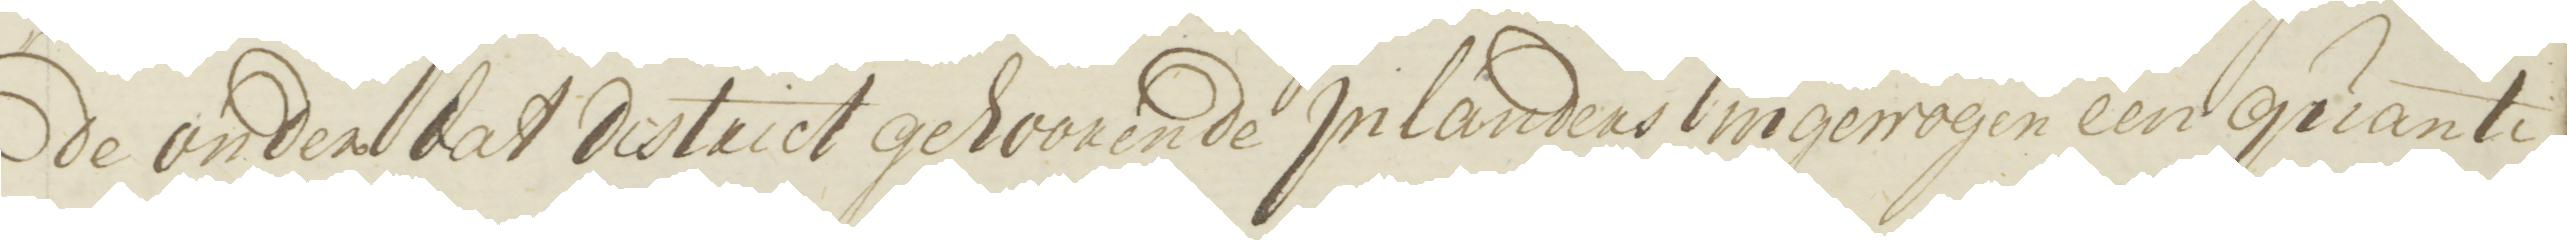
de onder dat district gehoorende Jnlanders in gewogen een quanti„
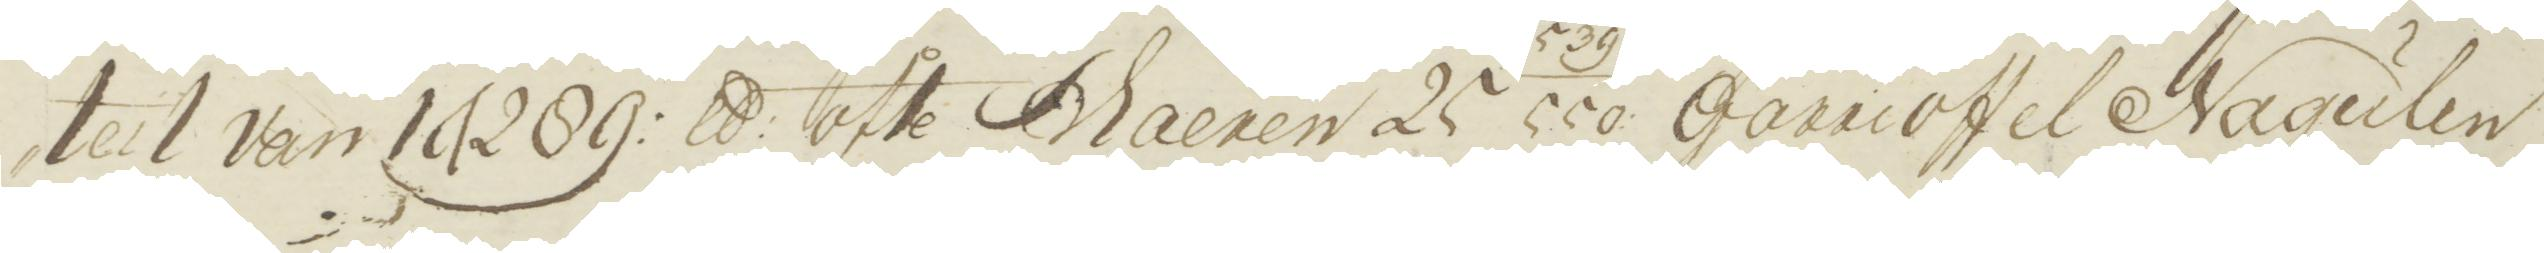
„teit van 14289: lb: ofte Schaeren 25 539/550: g'arrioffel Nagulen
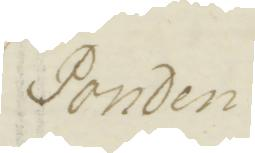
Ponden
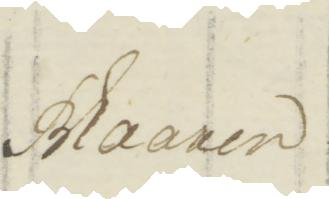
Bhaaren
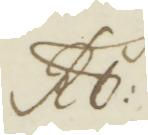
Rd:s
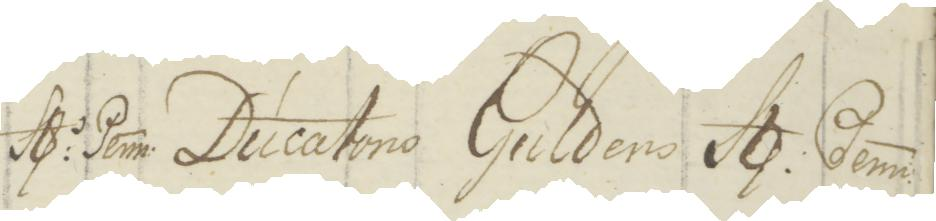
Stv:s Penn: Ducatons Guldens Stv: Penn:
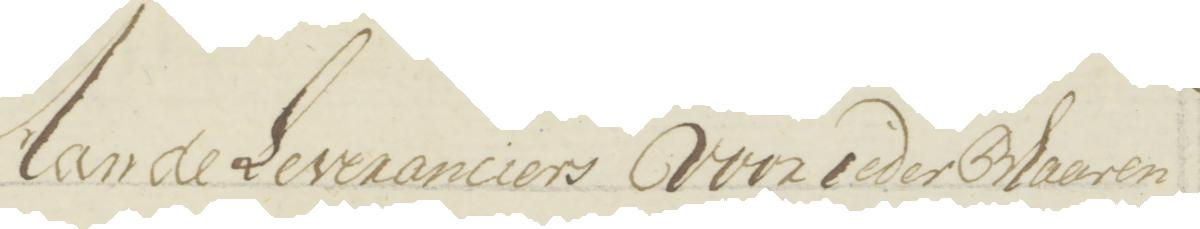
Aan de Leveranciers voor ieder Waaren
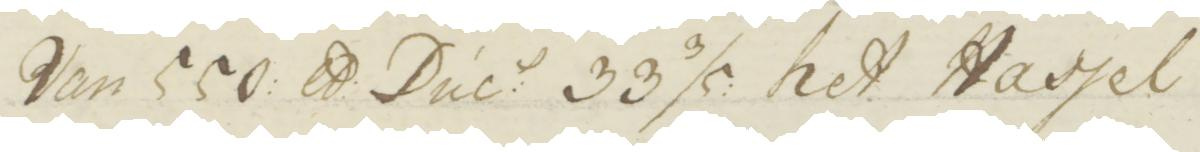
Van 550: lb: Duc:s 33 3/5: het Hassel
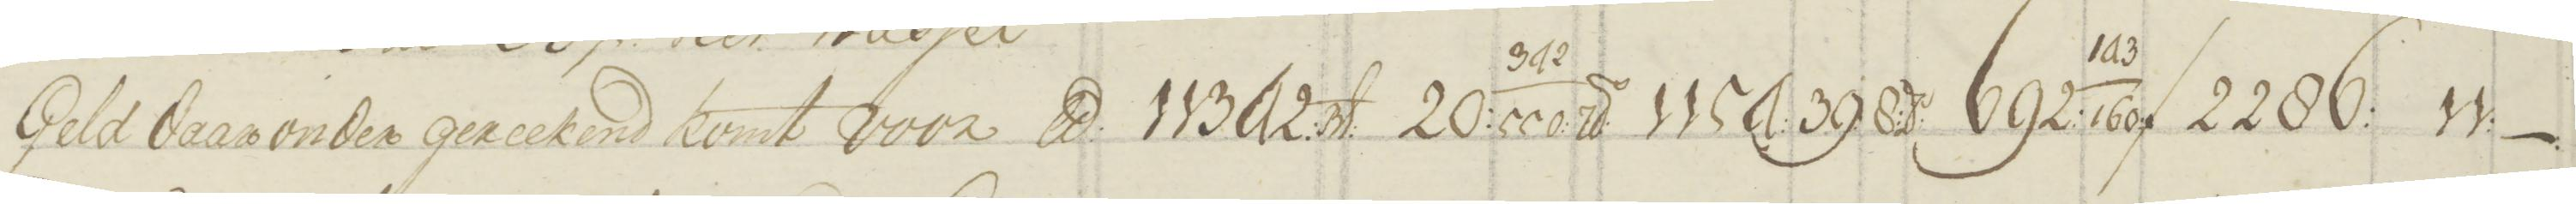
Geld daar onder gereekend komt voor lb: 11342:bh: 20: 342/550: rd:s 1154:39:8:d:s 692: 143/160: ƒ 2286: 11:
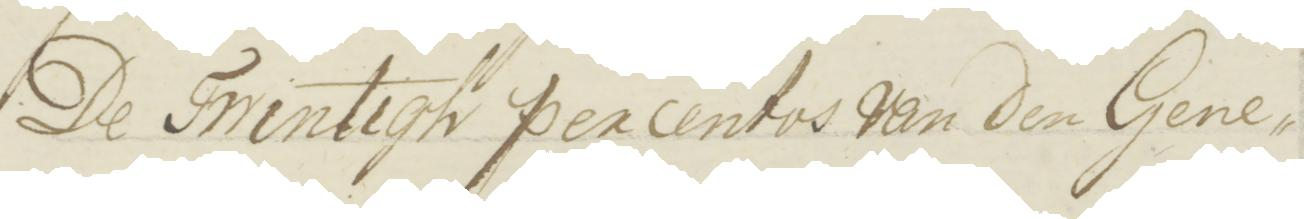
De Twintigh percentos van den Gene„
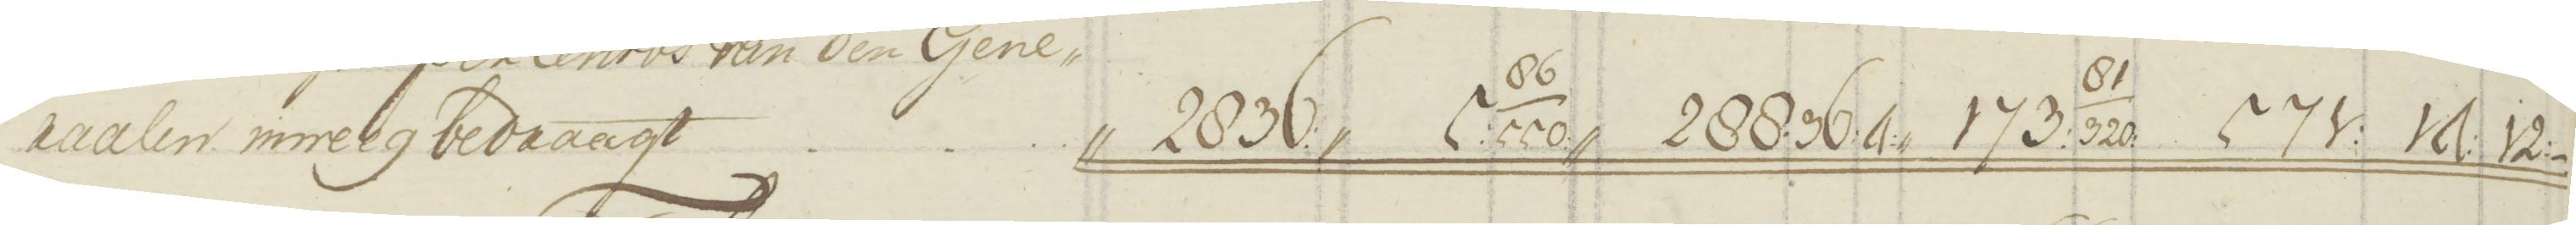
raalen. inweeg bedraagt . . . . „ 2836:„ 5: 86/550:„ 288.36:4:„ 173:81/320: 571: 14: 12:_
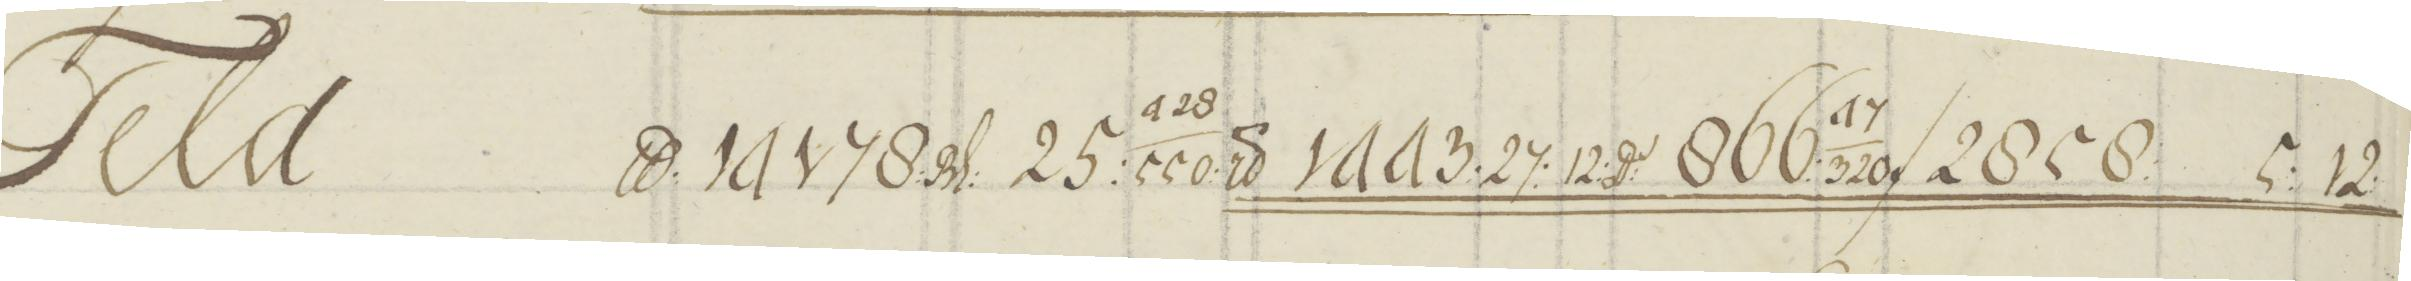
Teld lb: 14178:bh: 25: 428/550:rd 1443:27:12:d:s 866:47/320 ƒ2858: 5: 12:
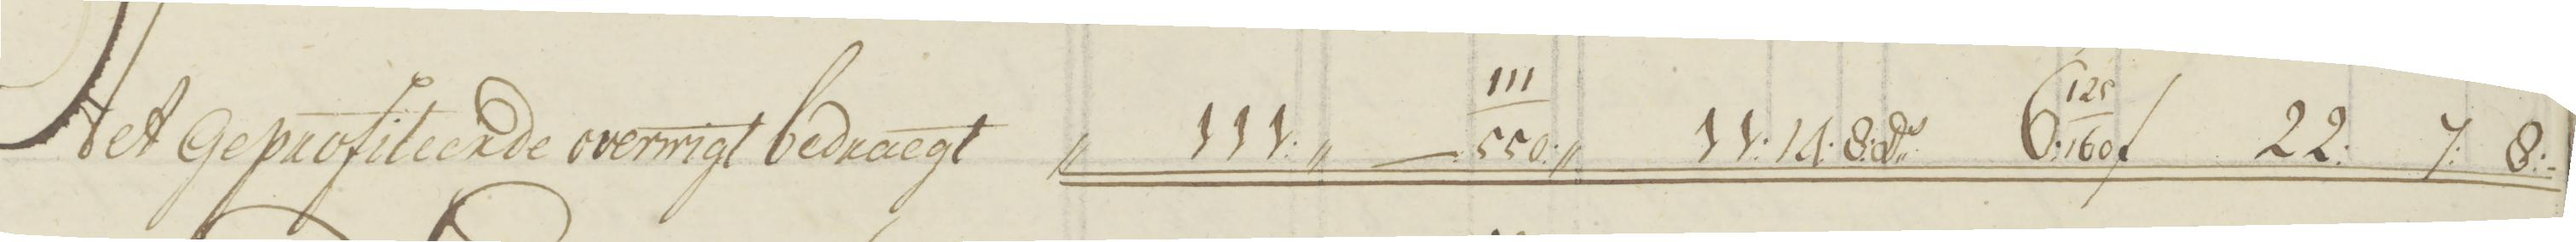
Het geprofiteerde overwigt bedraegt „ 111:„ — 111/550:„ 11:14:8:D„s 6:125/160 ƒ 22: 7: 8:-
